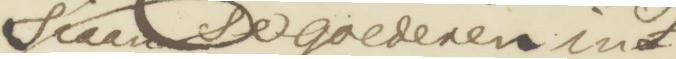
siaanse goederen in ’t
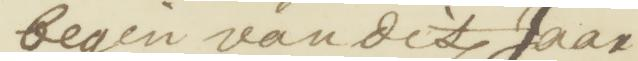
begin van dit Jaar
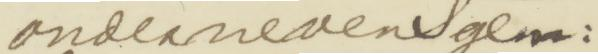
onder nevens gem:
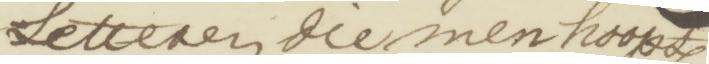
Letteren die men hoopt
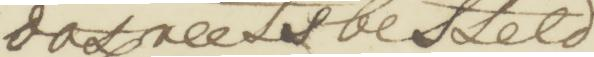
dat reets besteld
